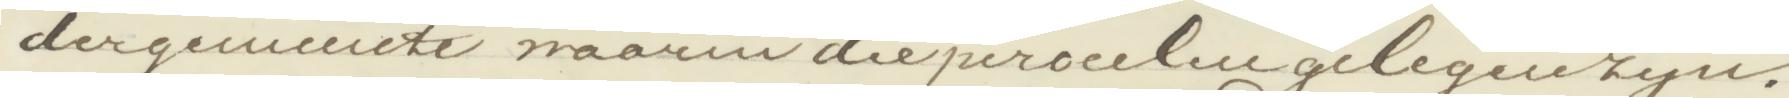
der gemeente waarin die perceelen gelegen zyn.
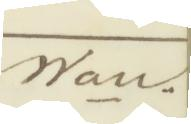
Wan„
